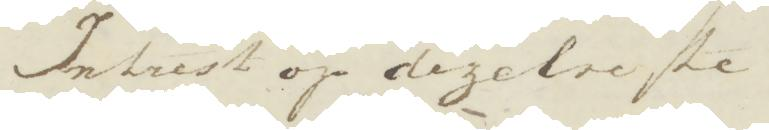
Intrest op dezelve te
